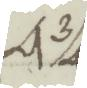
4¾
